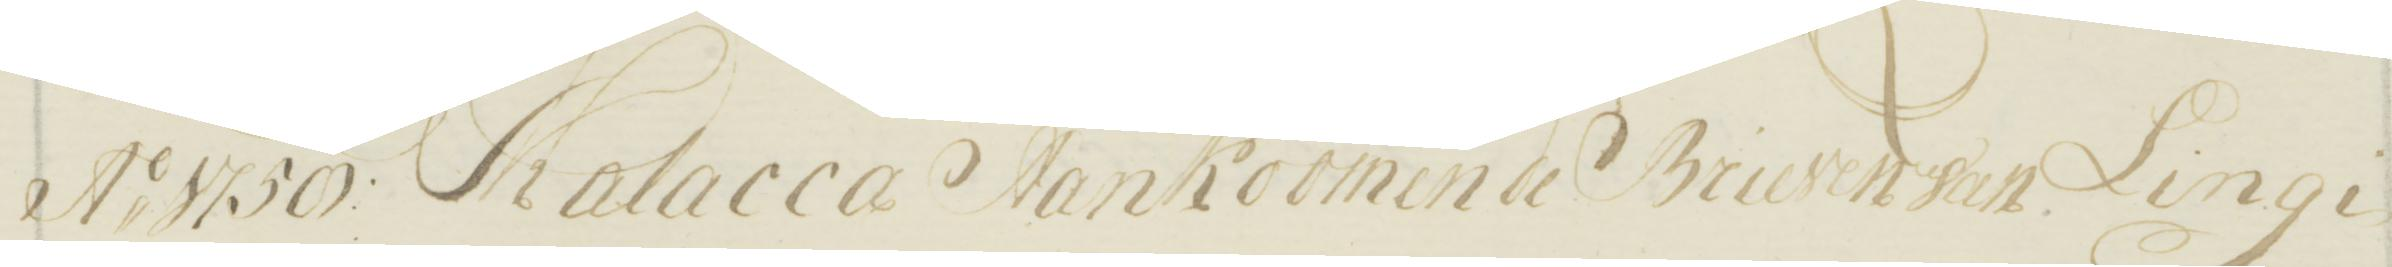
A„o 1750: Malacca Aankoomende Brieven van Lingi
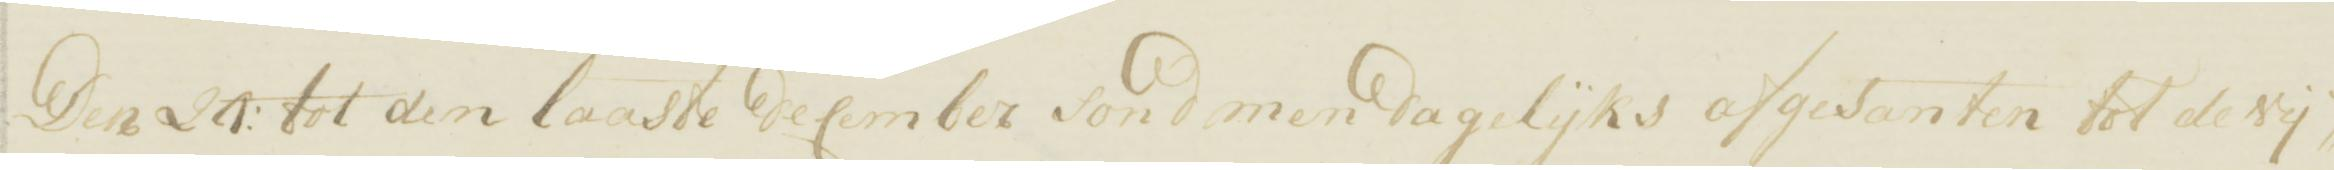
Den 24: tot den laaste december sond men dagelijks afgesanten tot de vij„
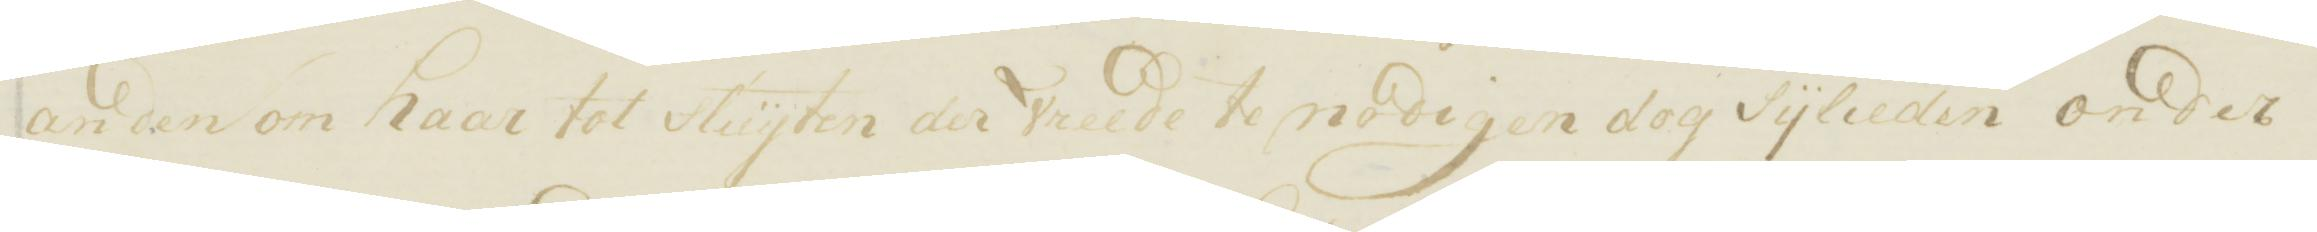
anden om haar tot sluijten der vreede te nodigen dog sijlieden onder
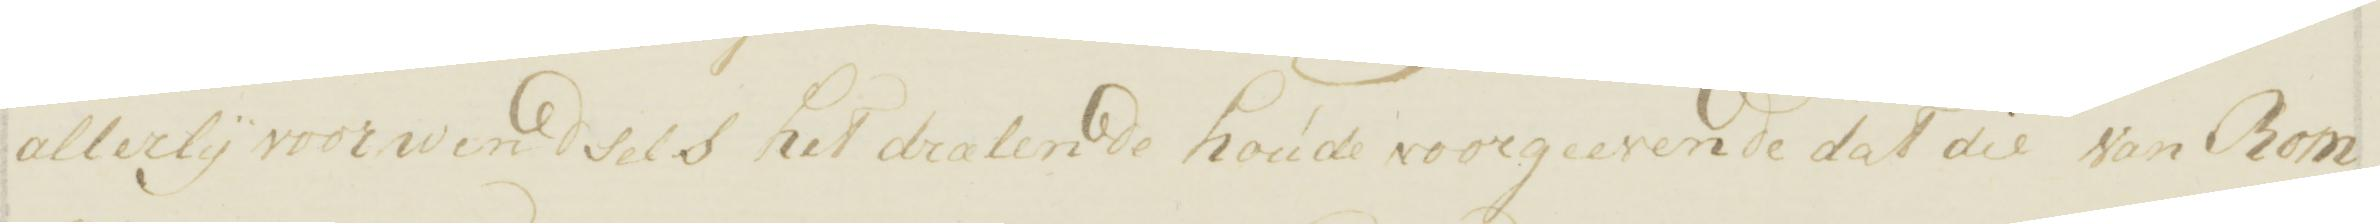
allerlij voorwendsels het dralende houde voorgeevende dat die van Rom
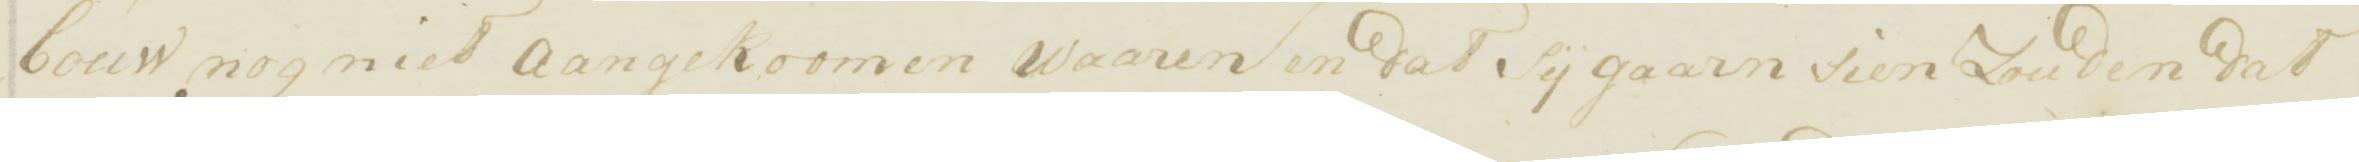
„bouw nog niet aangekoomen waaren en dat sij gaarn sien zouden dat
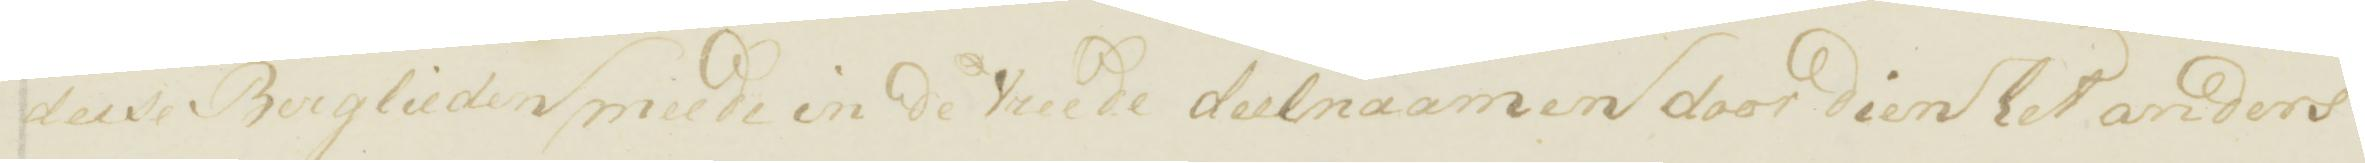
dees, Berglieden meede in de vreede deelnaamen door dien het anders
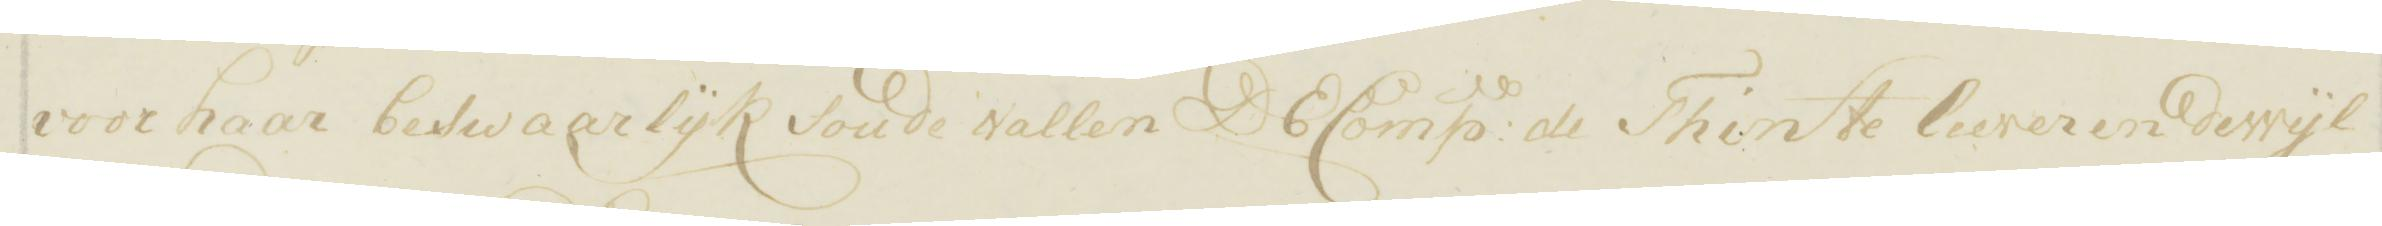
voor haar beswaarlijk soude vallen D E Comp:e de Thin te leeveren dewijl
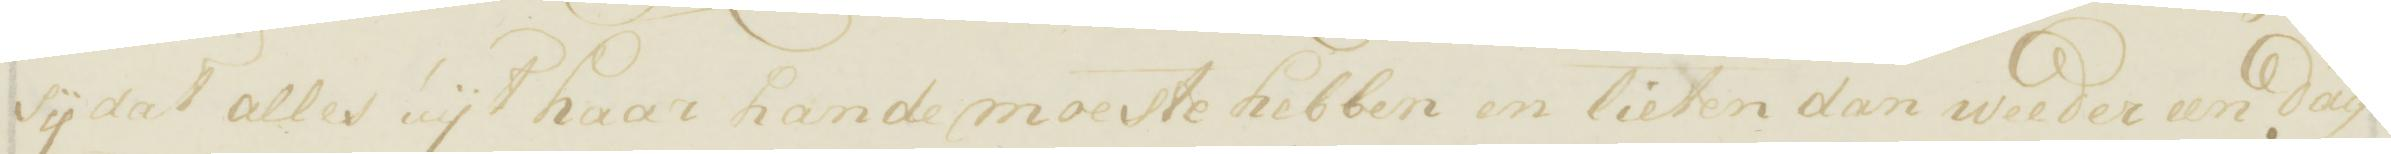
sij dat alles uijt haar hande moeste hebben en lieten dan weeder een dag
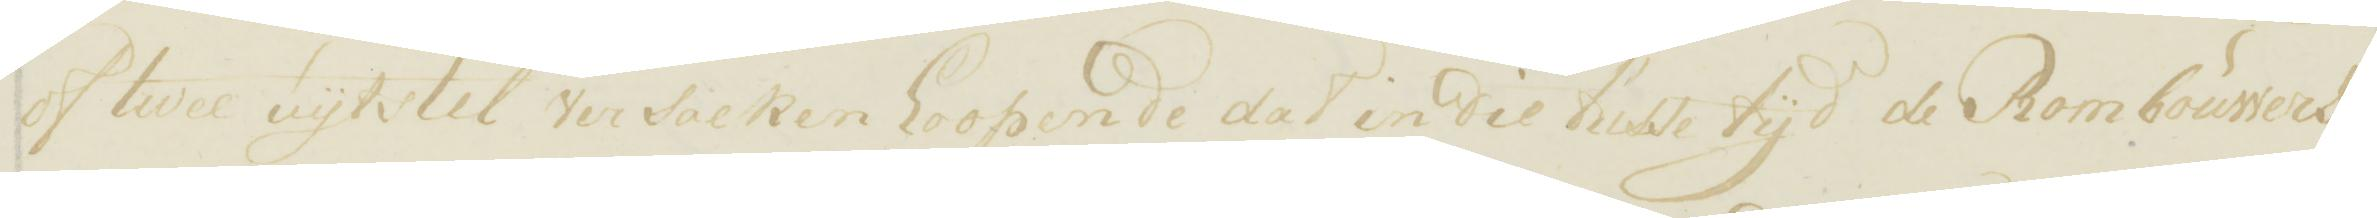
of twee uijtstel versoeken hoopende dat in die tusse tijd de Rombouwers
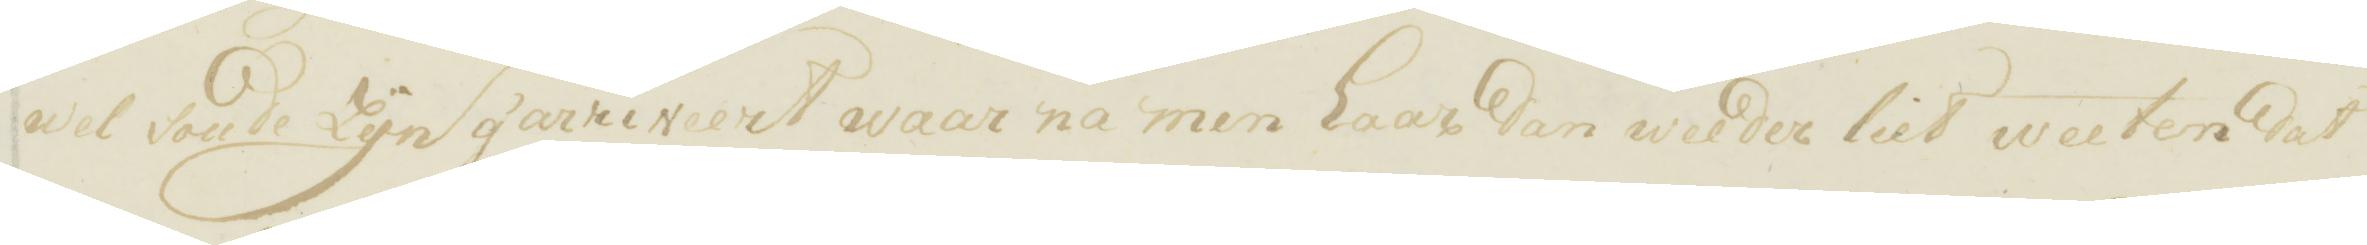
wel soude zijn g'arriveert waar na men haar dan weeder liet weeten dat
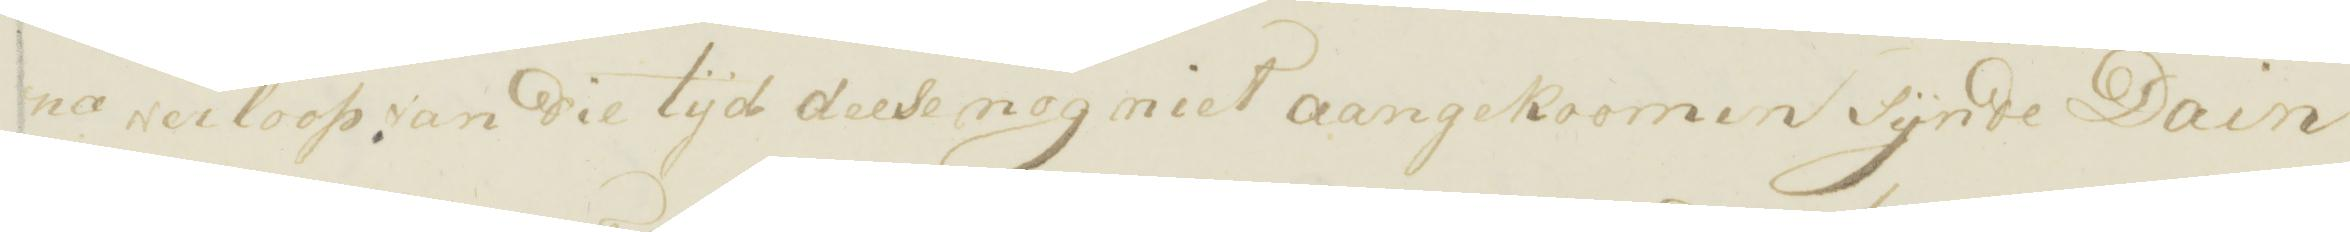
na verloop van die tijd deese nog niet aangekoomen sijnde Dain
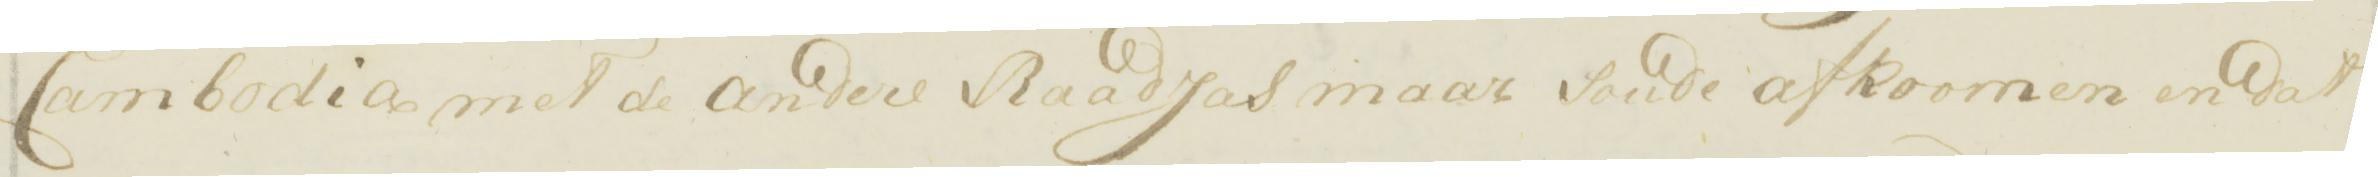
Cambodia met de andere Raadjas maar soude afkoomen en dat
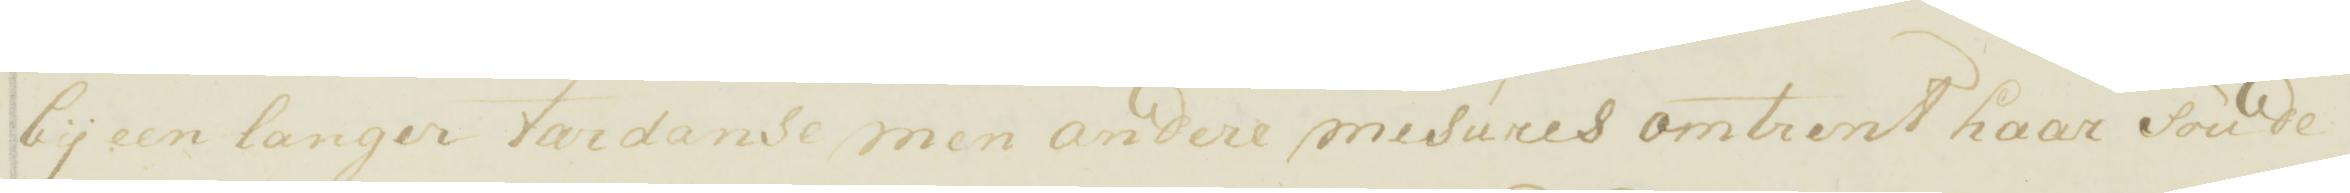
bij een langer tardanse men andere mesures omtrent haar soude
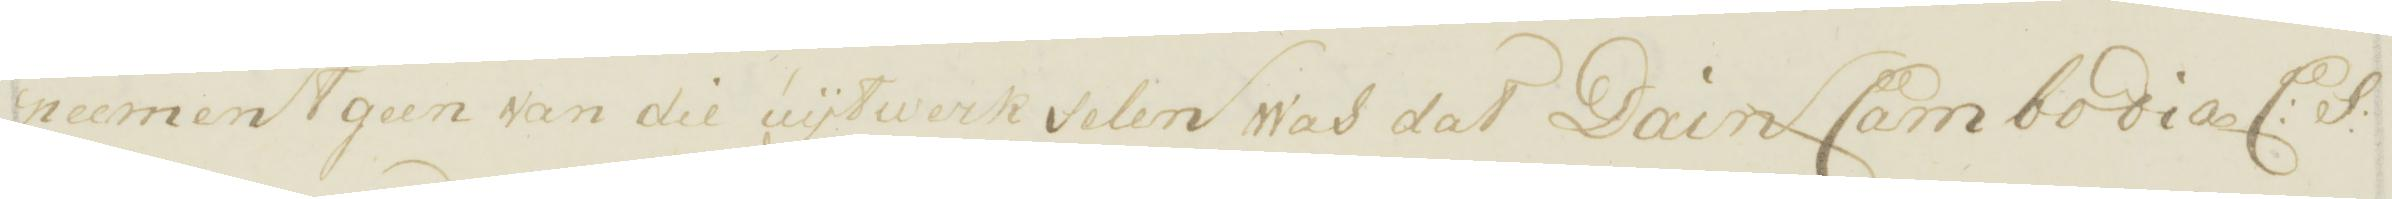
neemen 't geen van die uijtwerkselen was dat Dain Cambodia C: S:
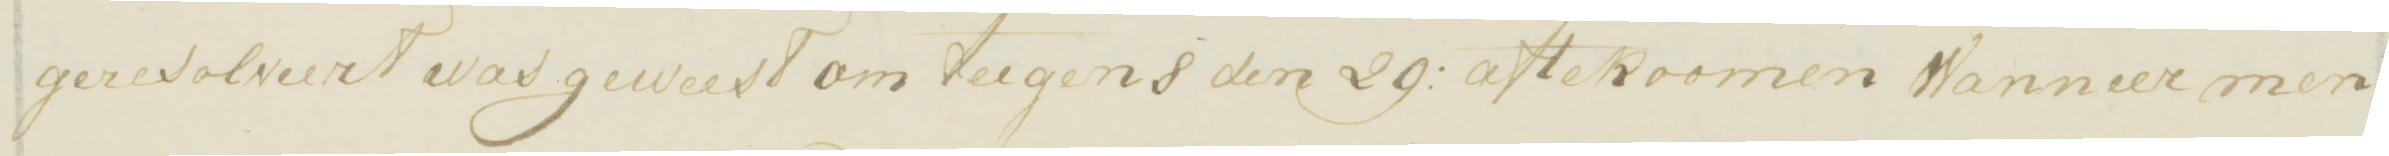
geresolveert was geweest om teegens den 29: af te koomen wanneer men
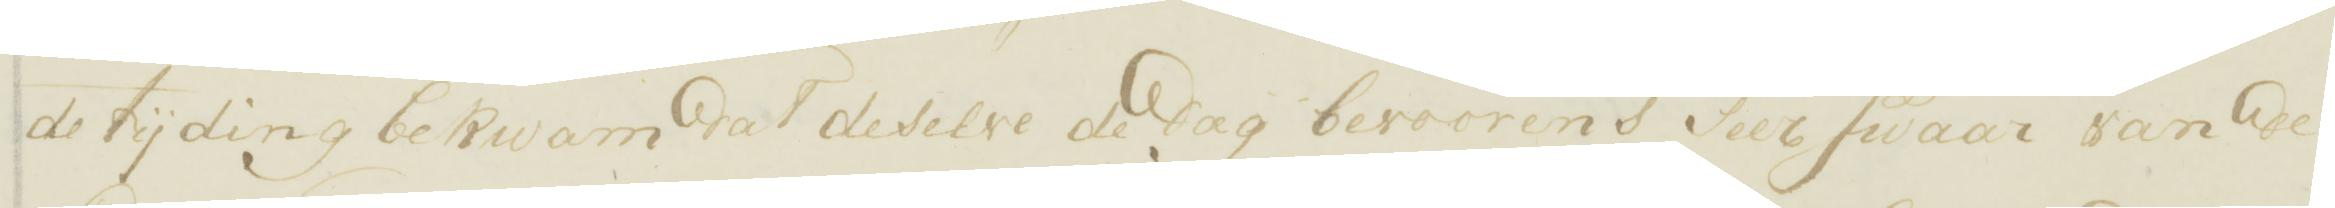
de tijding bekwam dat deselve de dag bevoorens seer swaar van de
